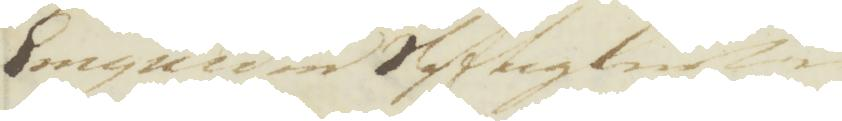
Een gulden Vijftig Cents
